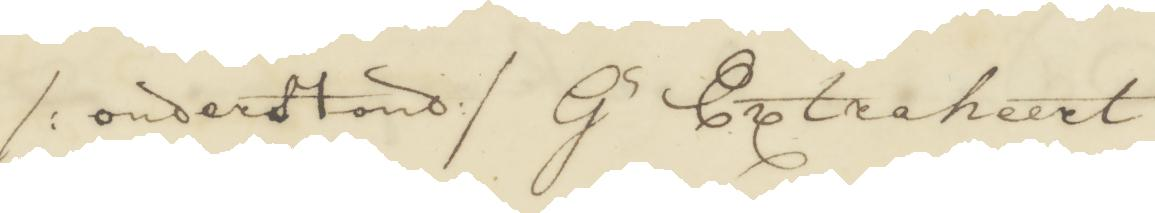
/: onder stond:/ G' Extraheert
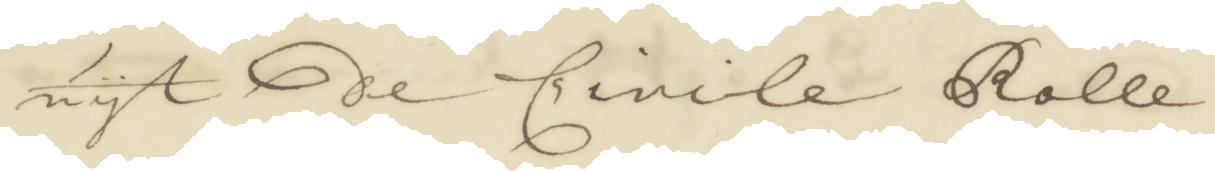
uijt de Civile Rolle
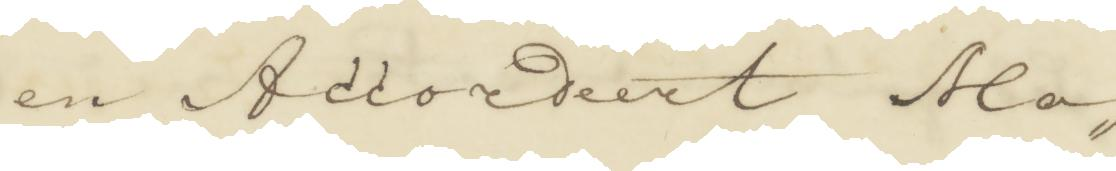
en Accordeert Ma„
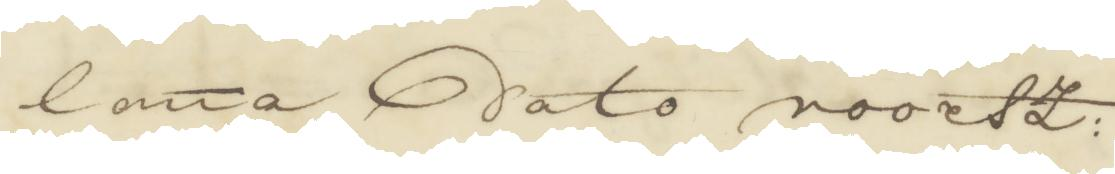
lacca dato voorsz:
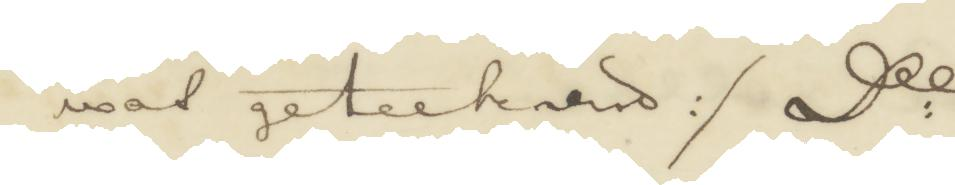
/: was geteekend:/ D:l
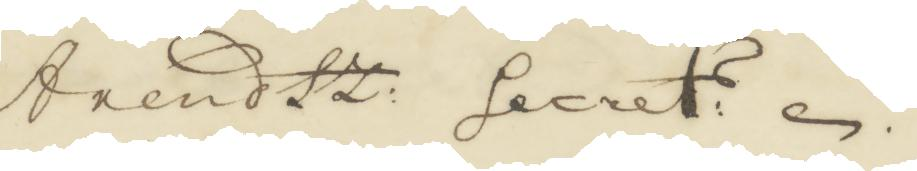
Arendsz: secret:s
